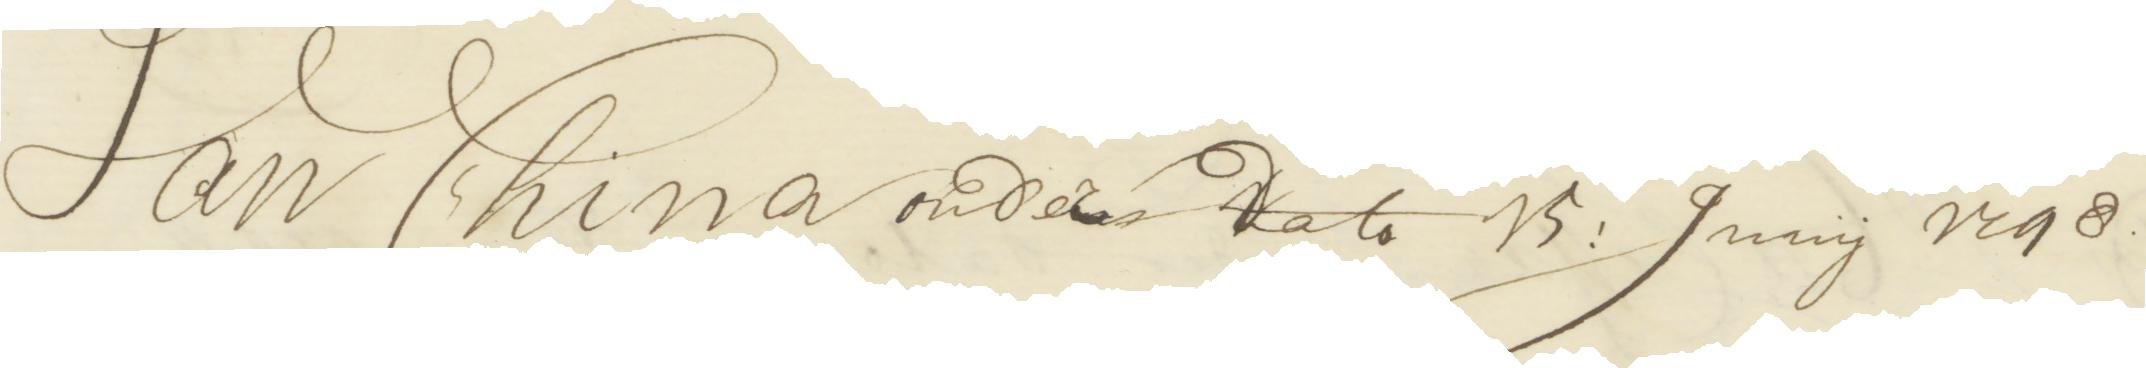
Van China onder dato 15:' Junij 1748
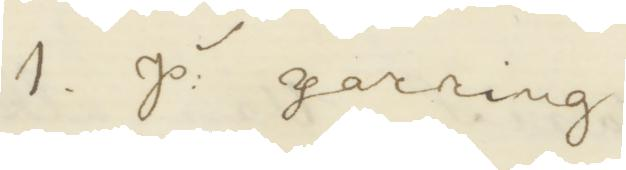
1. p:s parring
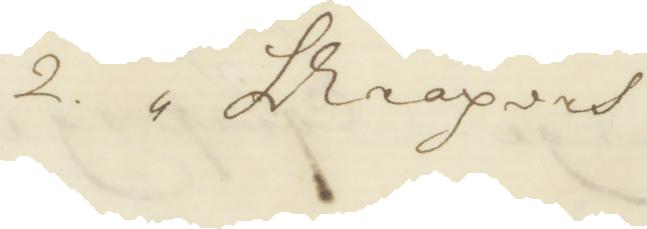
2. „ schrapers
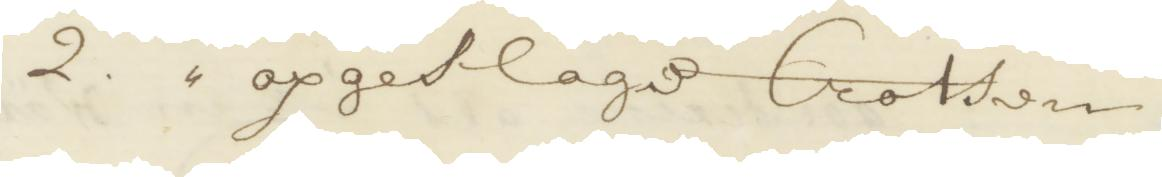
2. „ opgeslage trotsen
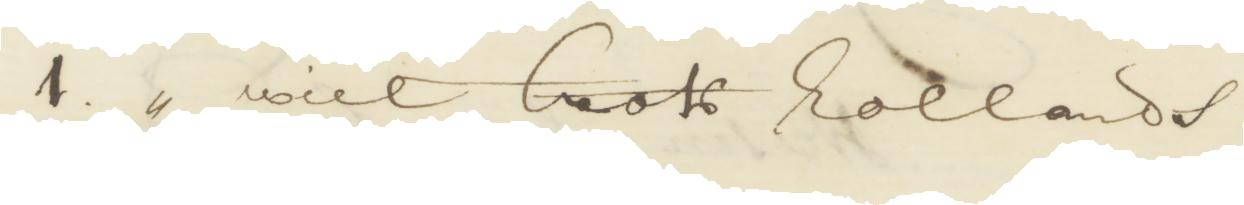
1. „ wiel trots hollands
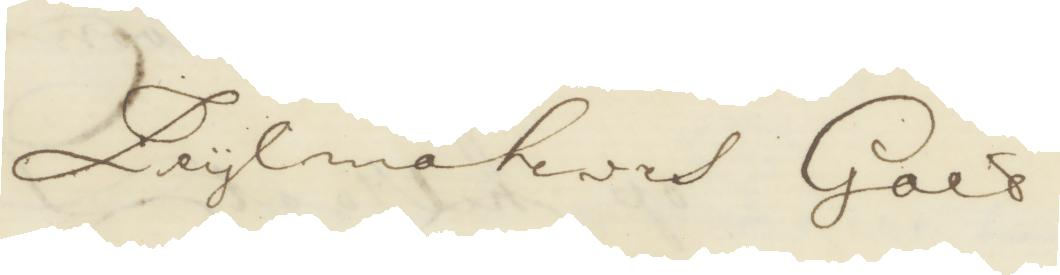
Zeijlmakers Goed
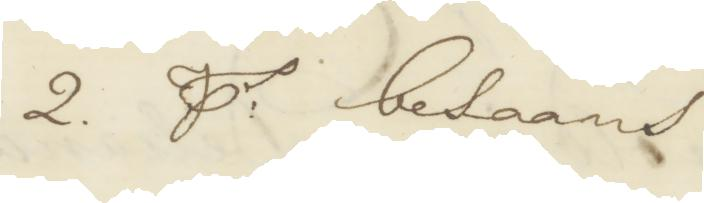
2. p:s besaans
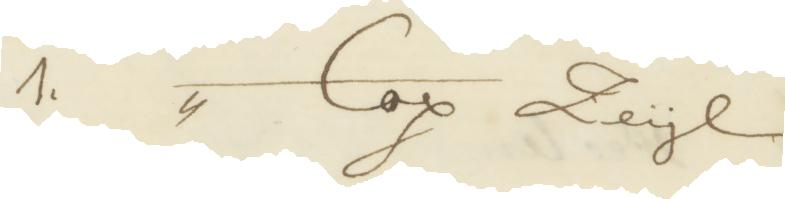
1. „ top Zeijl
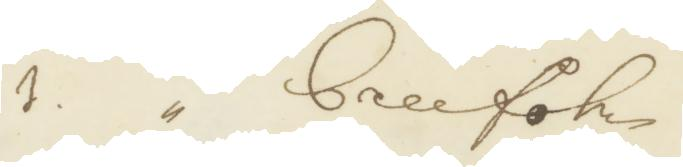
1. „ breefok
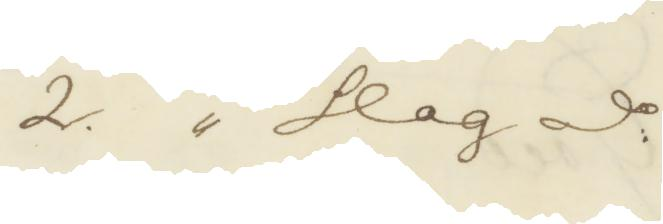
2. „ slag d:o
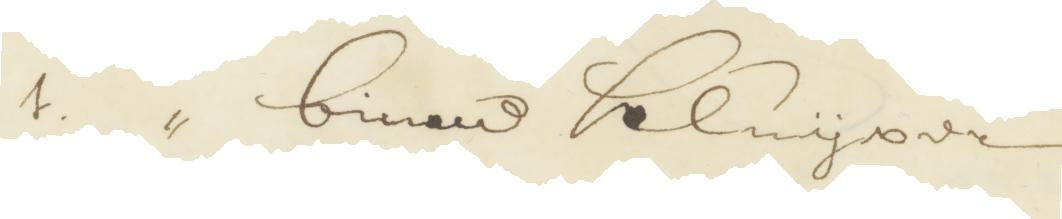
1. „ binne kluijver
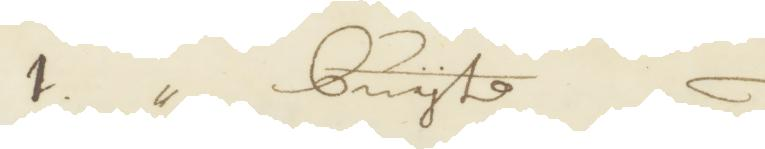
1. „ buijte —
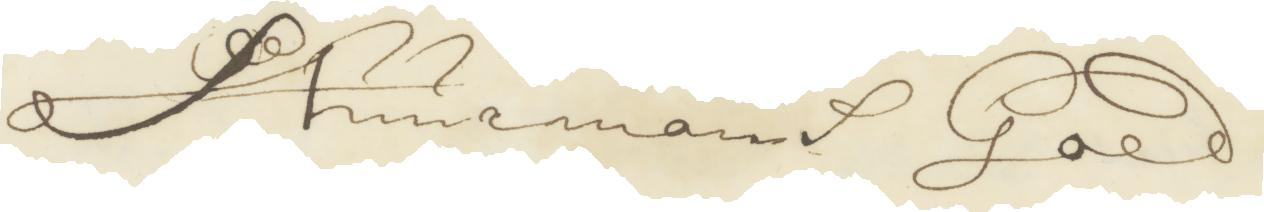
Stuurmans Goed
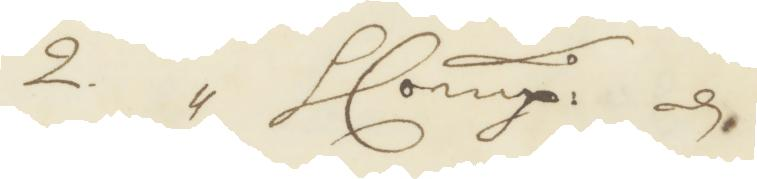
2. „ sComp:s en
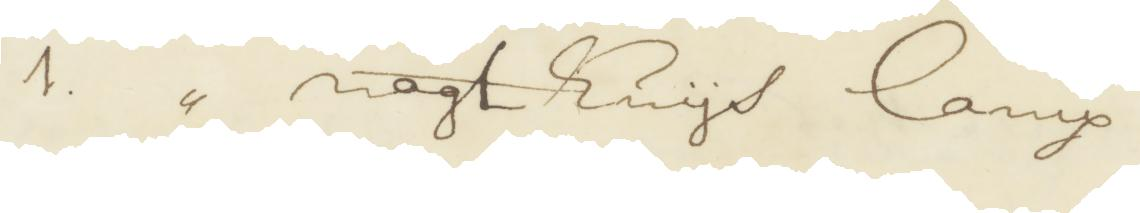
1. „ nagthuijs lamp
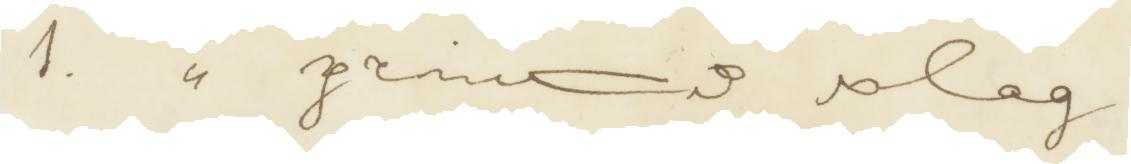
1. „ prince vlag
